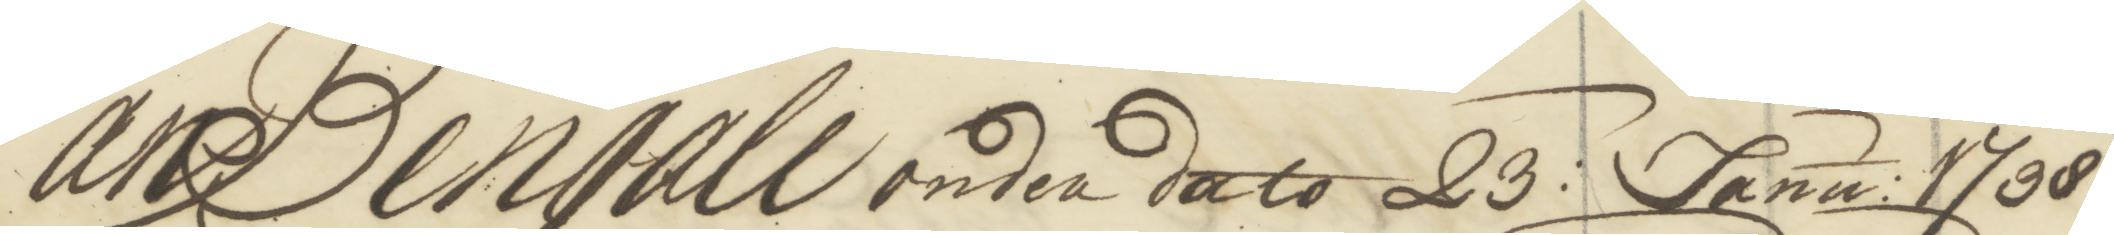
Van Bengale onder dato 23:' Ianu: 1738
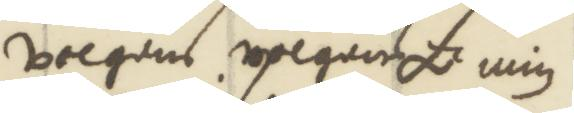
volgens volgens te min
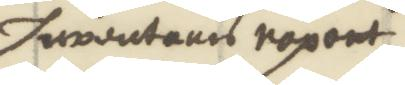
Jnventaris raport
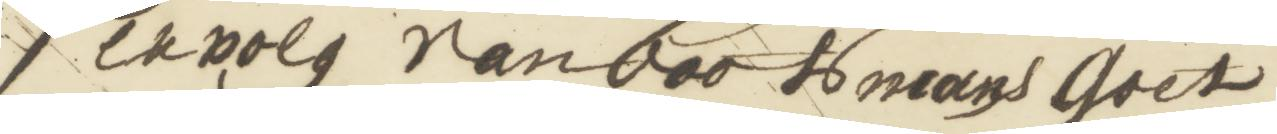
Vervolg van bootsmans goet
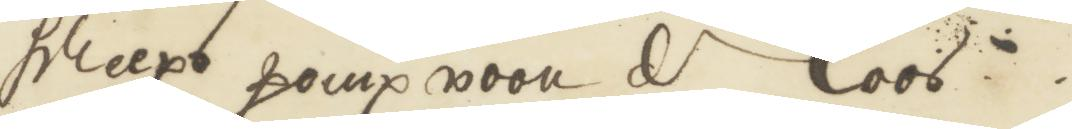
scheeps pomp voor de loos
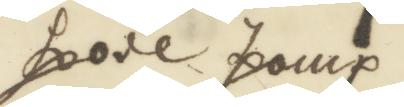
spoel pomp
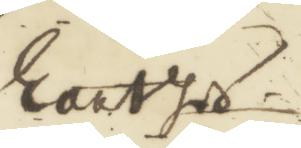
hartjes -
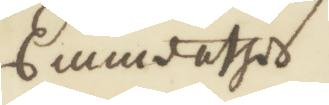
Emmertjes
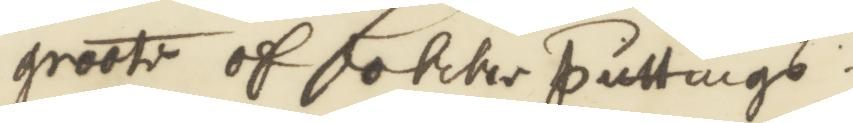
groote of fokke puttings
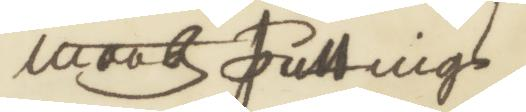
mark puttings
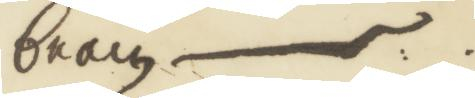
bram _:o
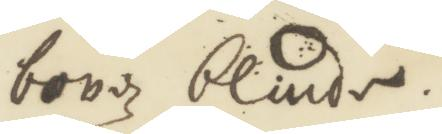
boven blinde .
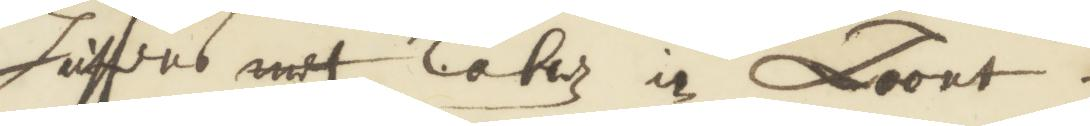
Juffers met laken in zoort
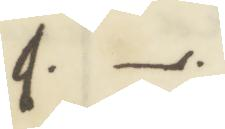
4. — .
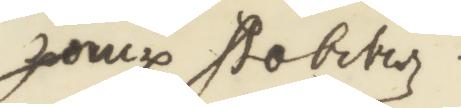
pomp stokken
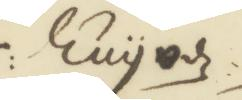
_:o huijven
